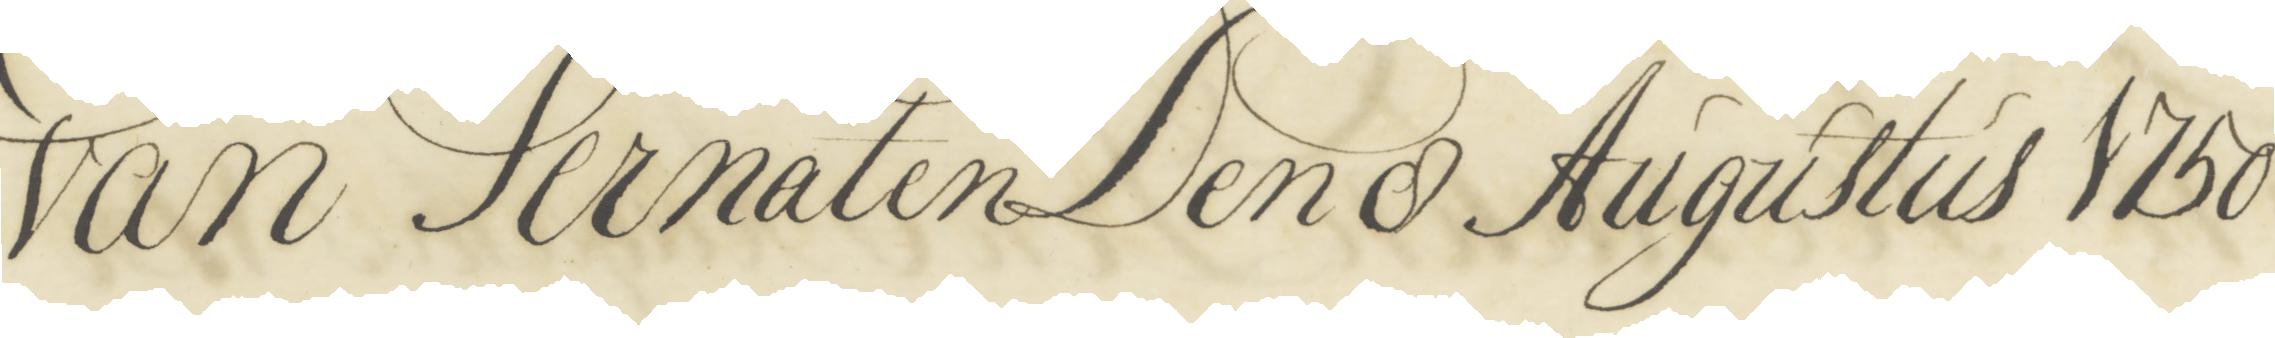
Van Ternaten Den 8 Augustus 1750
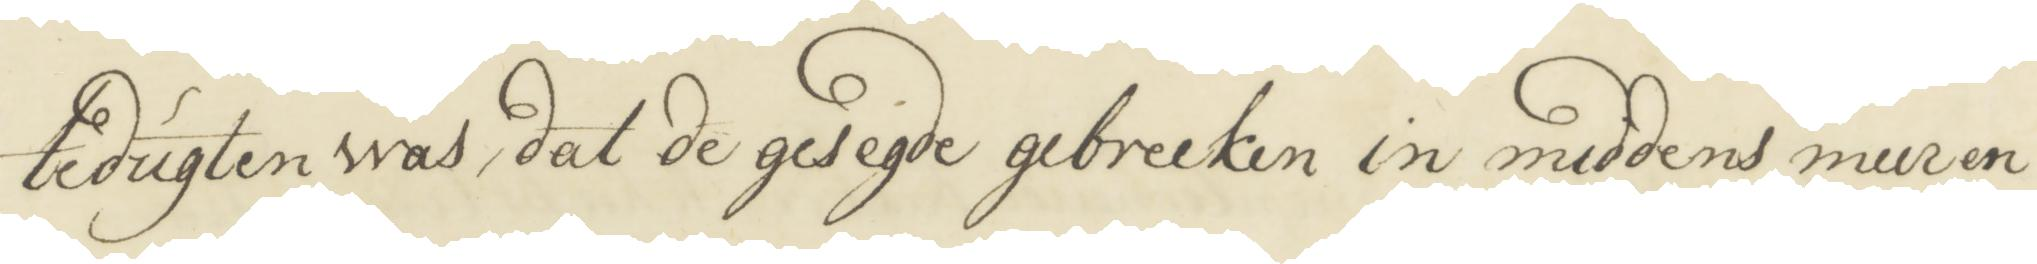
tedugten was, dat de gesegde gebreeken in middens meer en
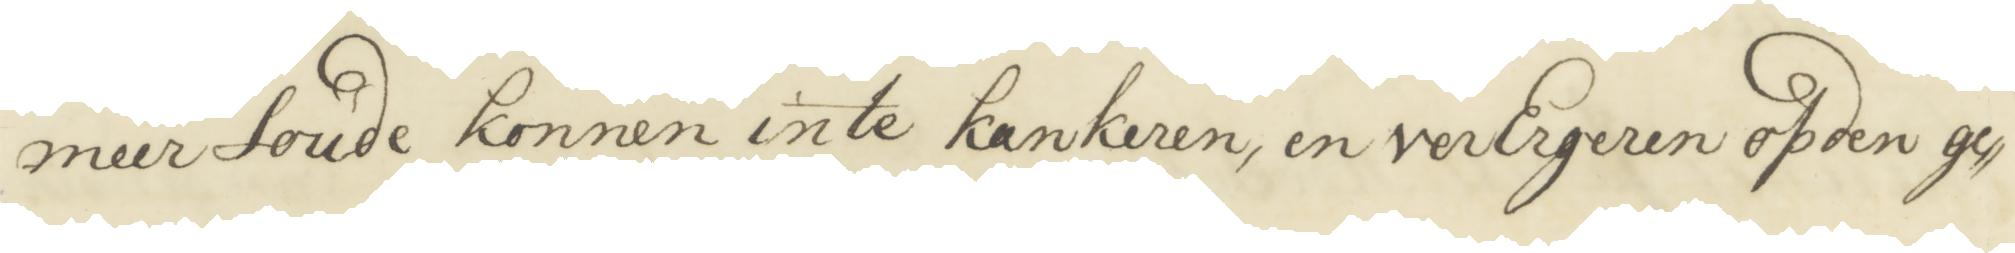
meer soude konnen in te kankeren, en verErgeren op den ge„
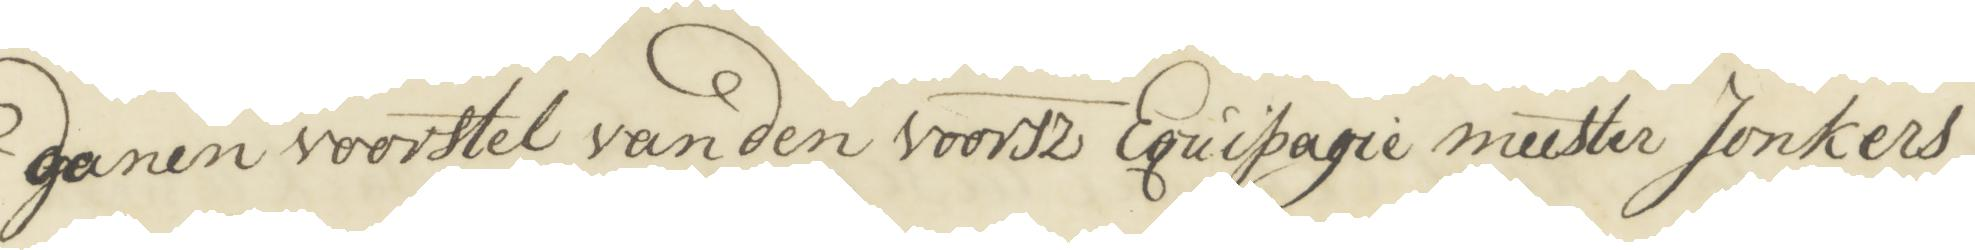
danen voorstel van den voorsz Equipagie meester Jonkers
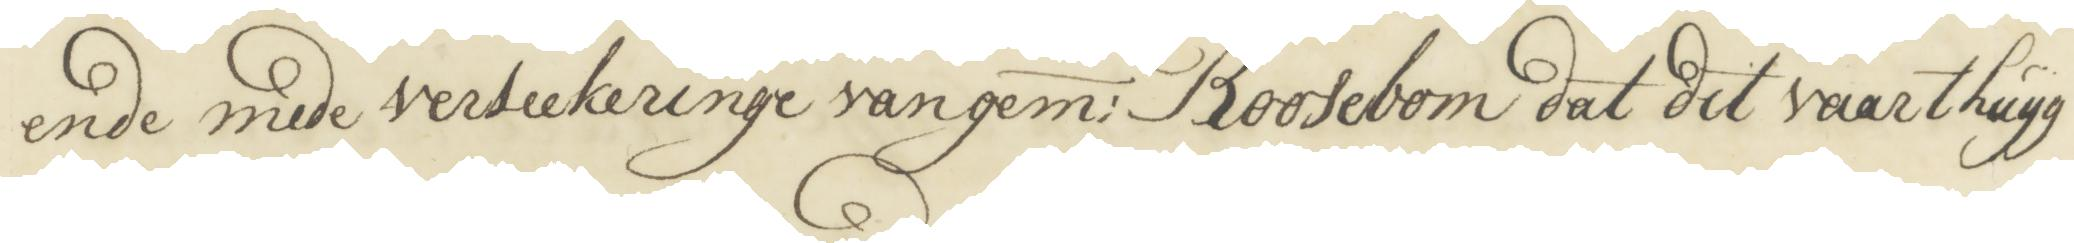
ende mede verteekeringe van gem: Roosebom dat dit vaarthuijg
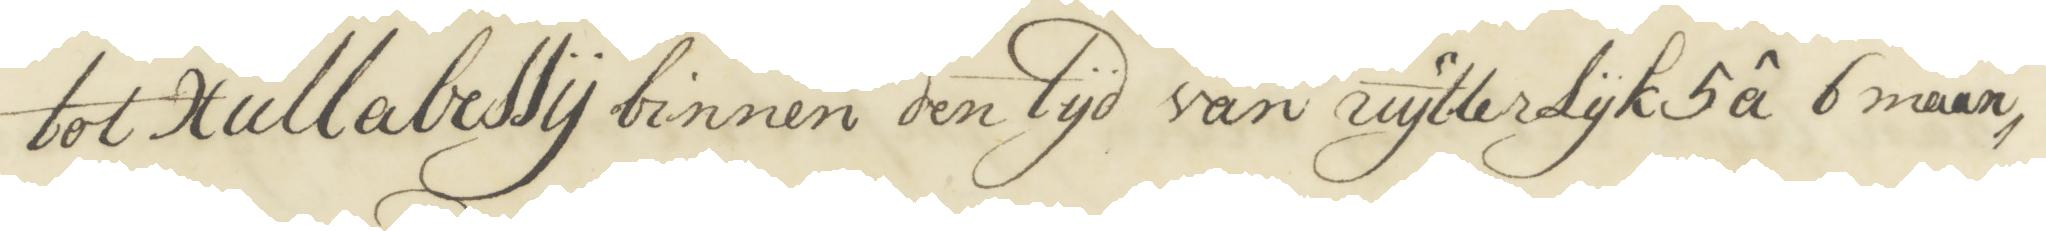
tot Xullabessij binnen den tijd van uijtterlijk 5 â 6 maan„
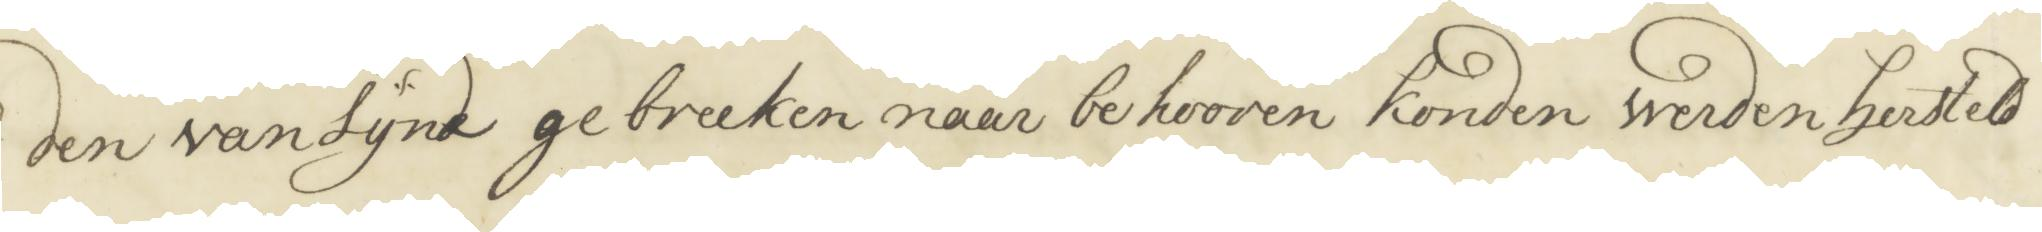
den van sijne gebreeken naar behooren konden werden hersteld
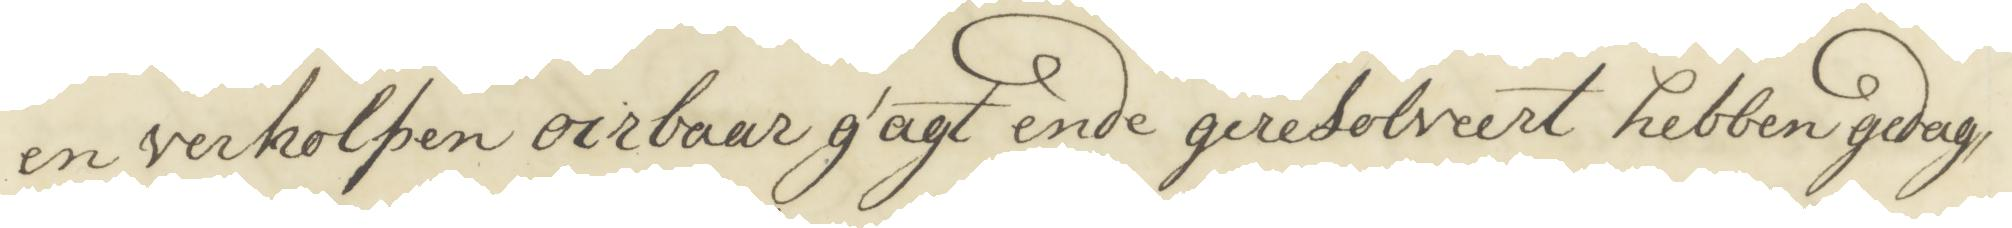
en verholpen oirbaar g’agt ende geresolveert hebben gedag„
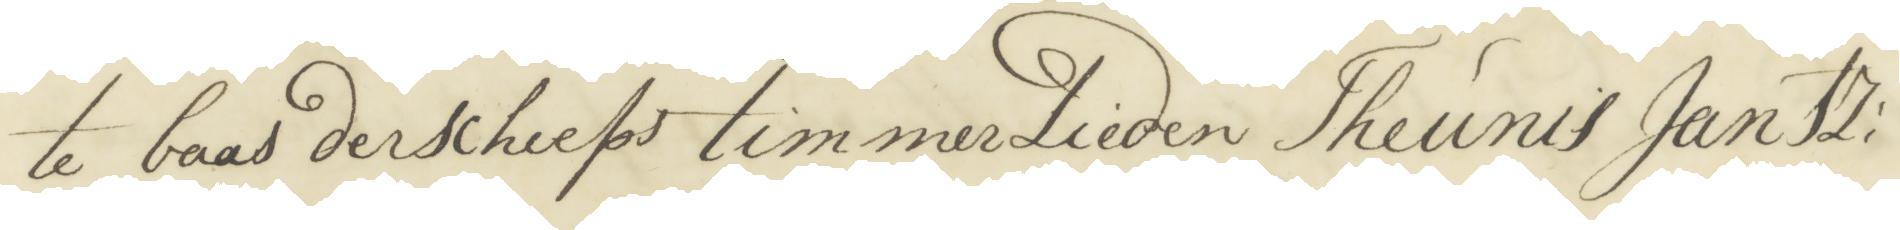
te baas derscheeps timmerlieden Theunis Jansz:
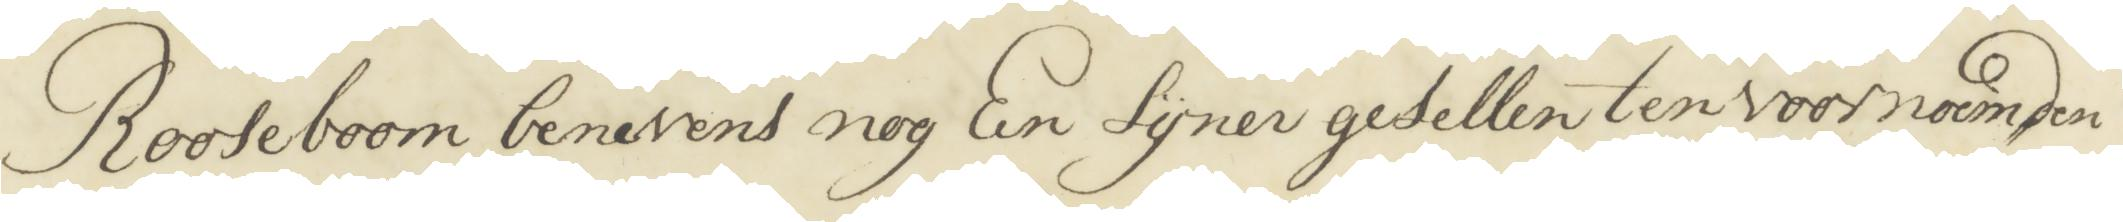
Rooseboom benevens nog Een sijner gesellen ten voornoemden
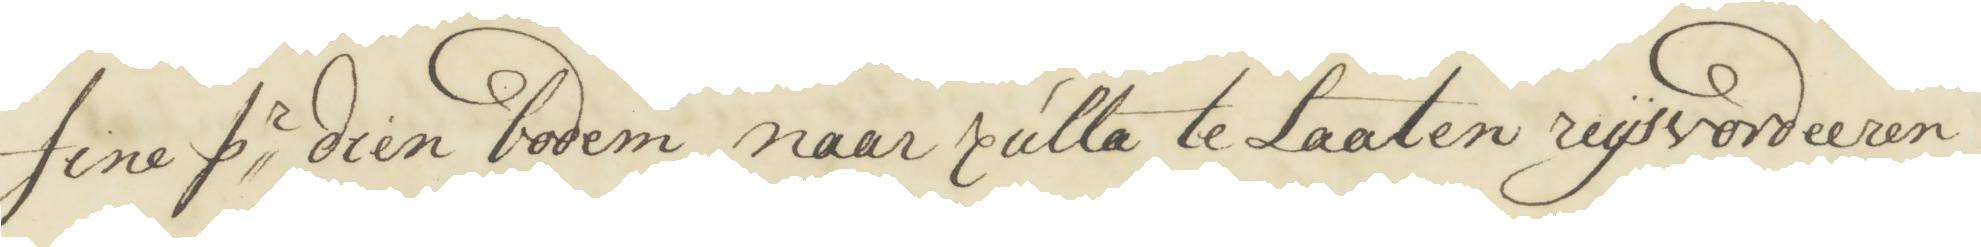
fine p„r dien bodem naar xulla te laaten reijs vordeeren
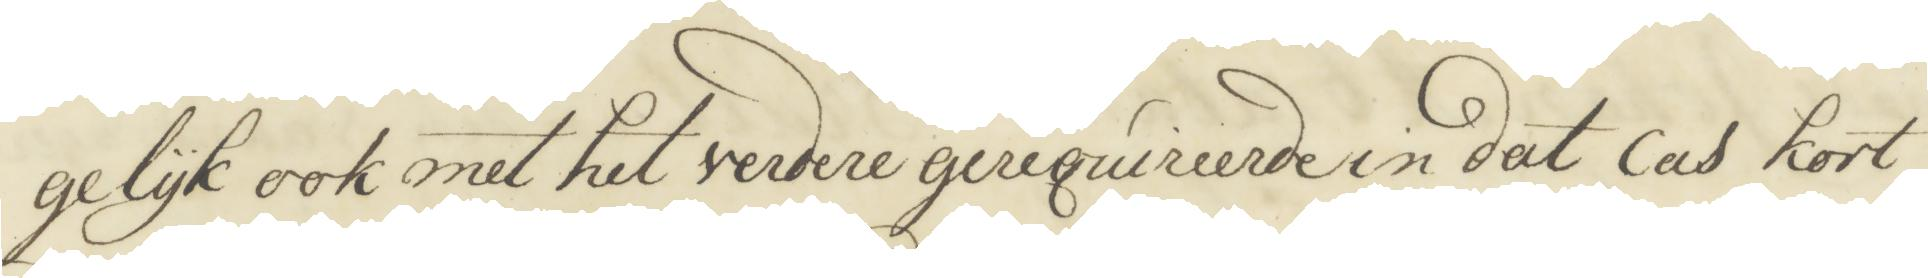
gelijk ook met het verdere gerequireerde in dat cas kort
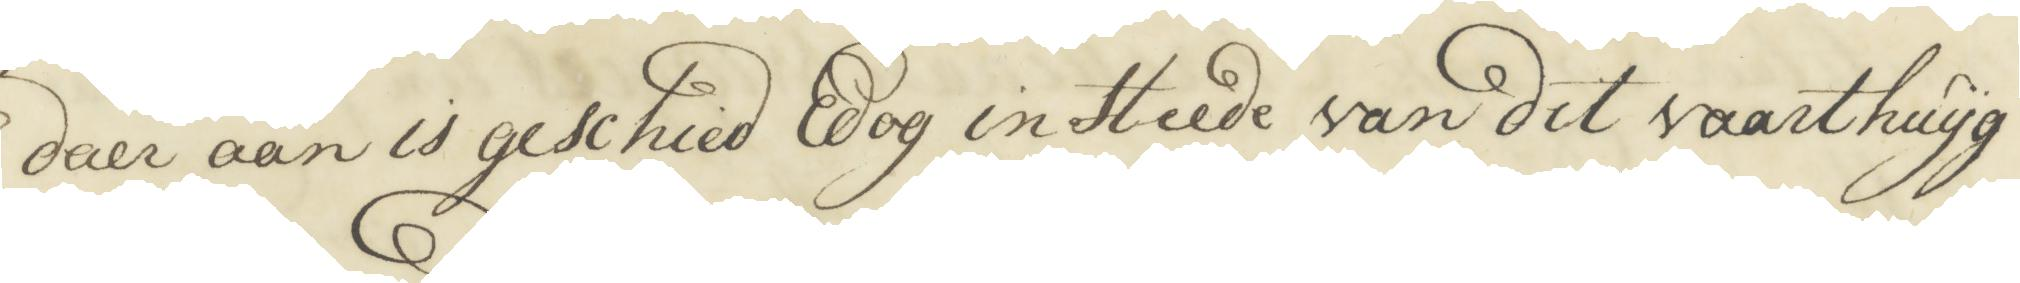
daer aan is geschied Edog insteede van dit vaarthuijg
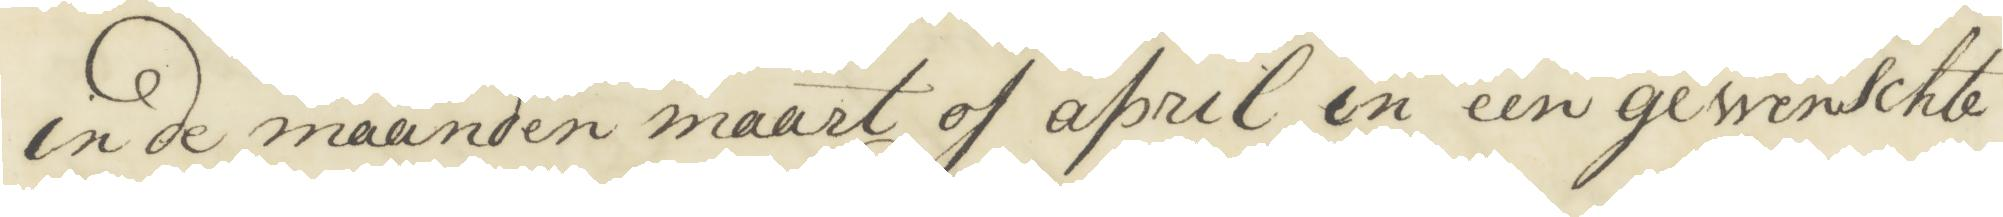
in de maanden maart of april in een gewenschte
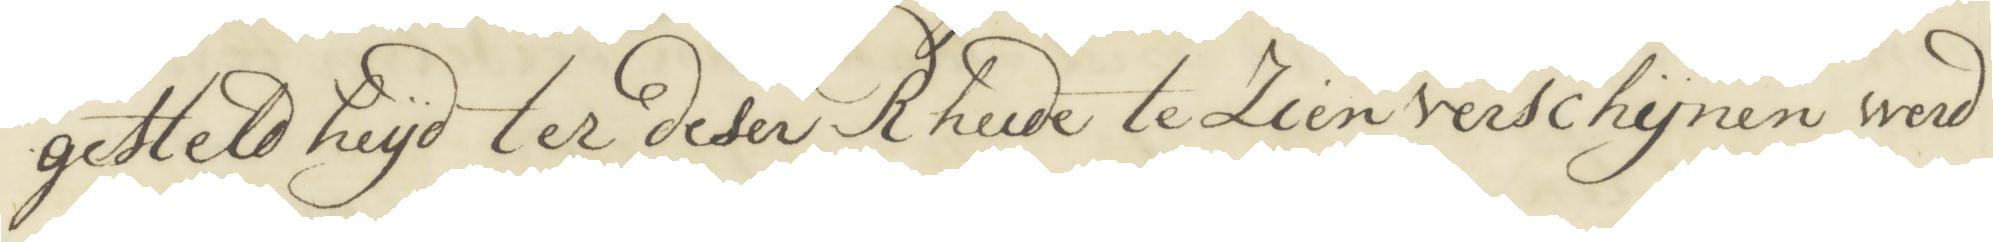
gesteld heijd ter deser Rheede te zien verschijnen werd
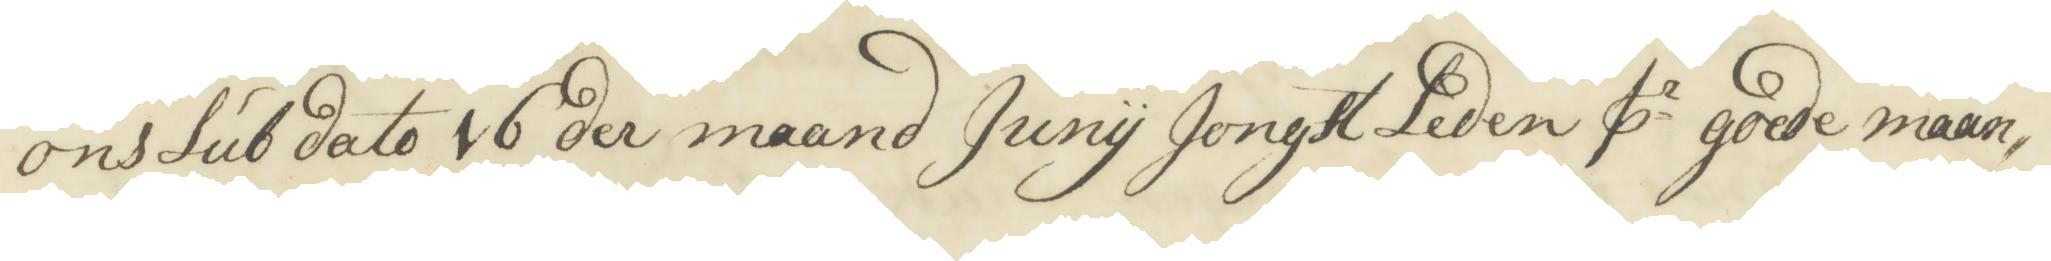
ons sub dato 16 der maand junij jongst Leden p=r goede maan„
